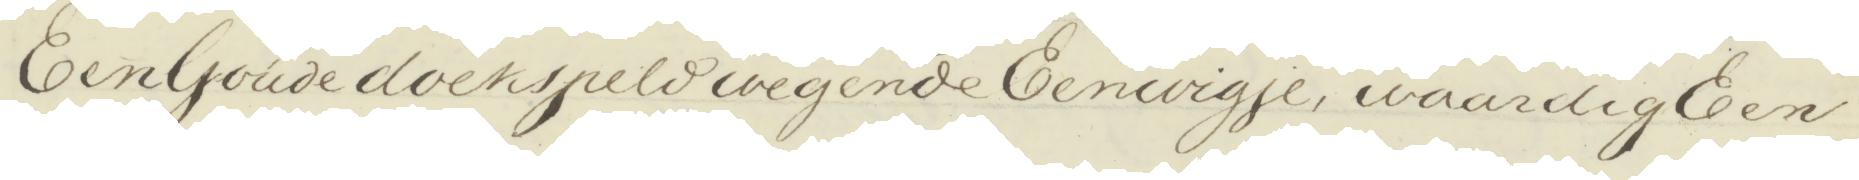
Een Goude doekspeld wegende Een wigje, waardig Een
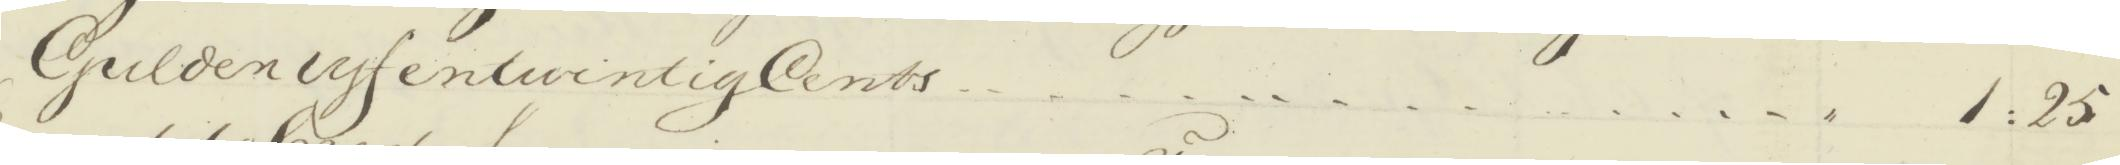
Gulden vyf en twintig Cents . . . . . . . . . . . . . . . „ 1: 25
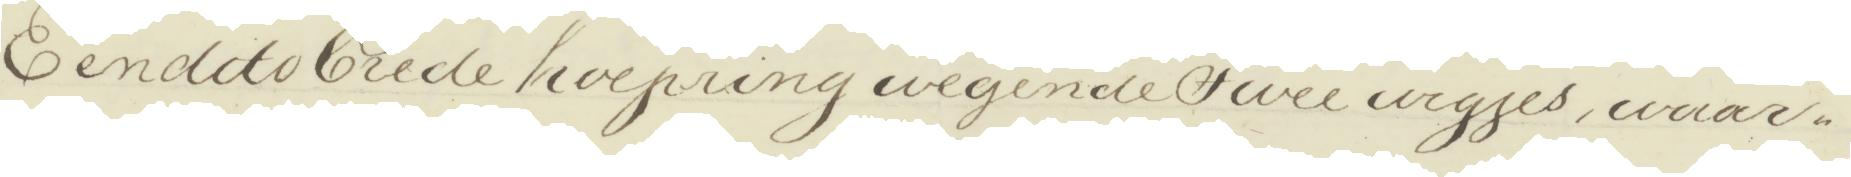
Een dito brede hoepring wegende Twee wigjes, waar„
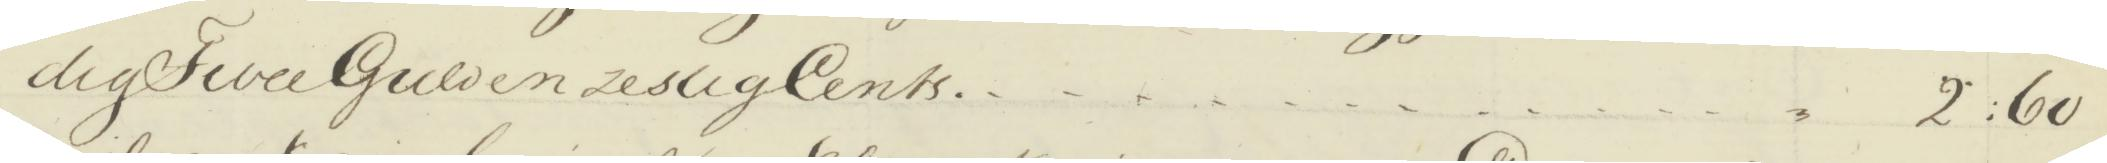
dig Twee Gulden zestig Cents. . . . . . . . . . . . . . . „ 2: 60
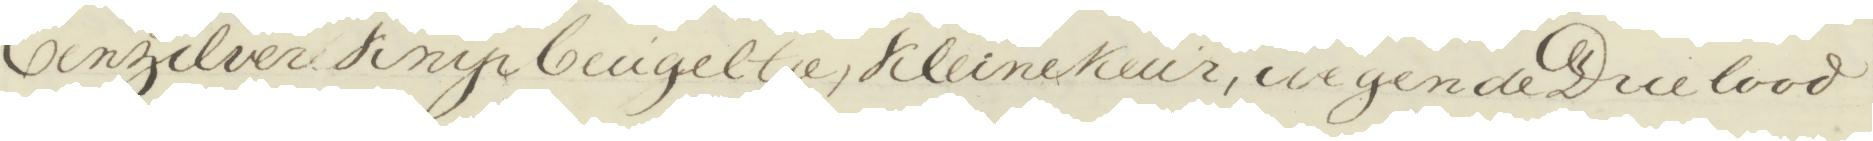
Een zilver knipbeugeltje, Kleine keur, wegen de Drie lood
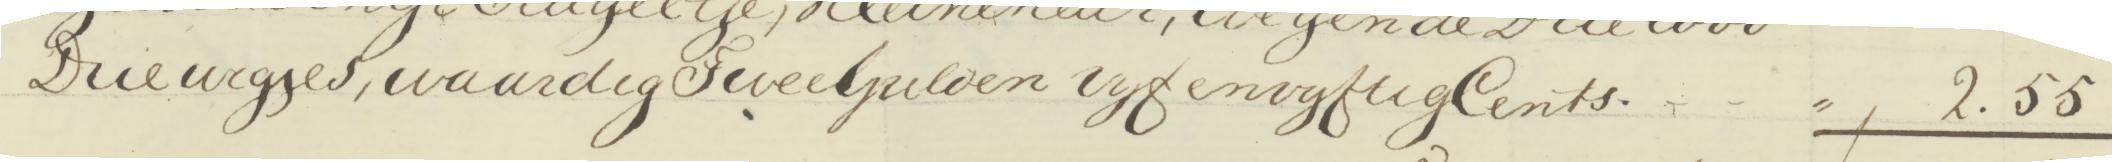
Drie wegjes, waardig Twee Gulden vyf en vyftig Cents. . . „2. 55
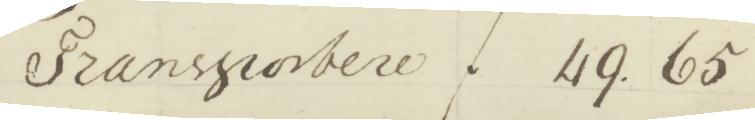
Transportere ƒ 49. 65
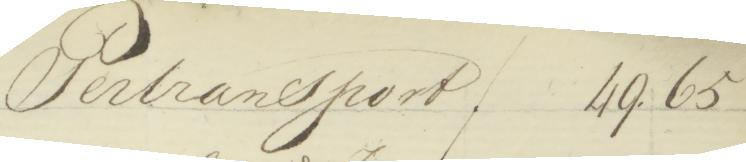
Per transport ƒ 49.65
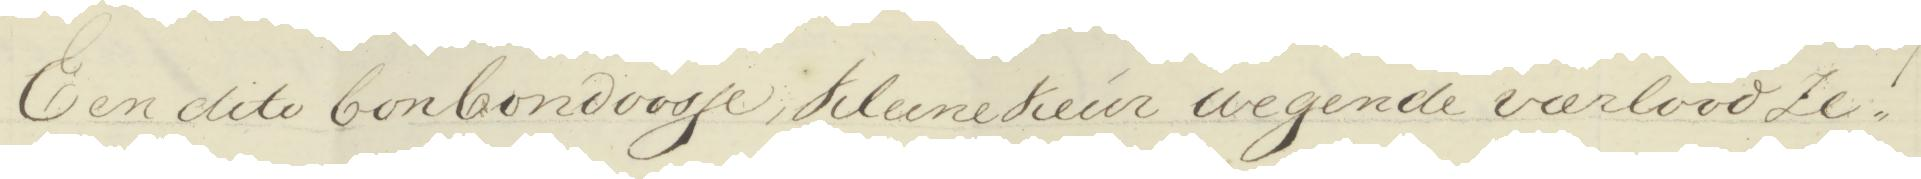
Een dito bonbondoosje, kleine keur wegende vier lood Ze„
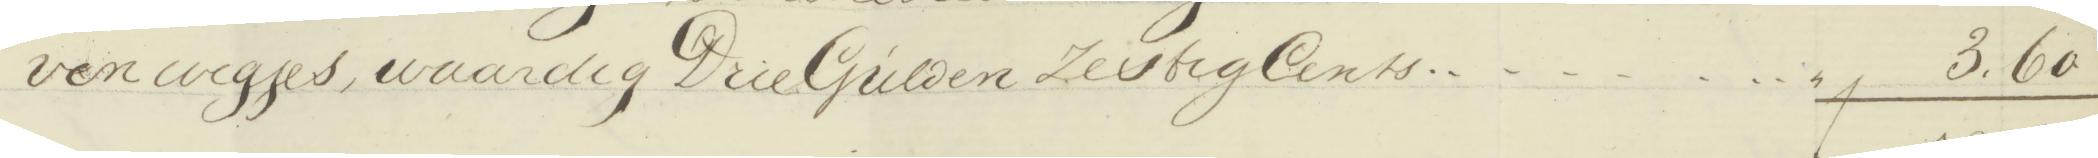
ven wigjes, waardig Drie Gulden zestig Cents. . . . . . . . . „ - 3. 60
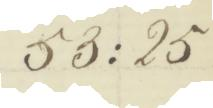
ƒ 53: 25
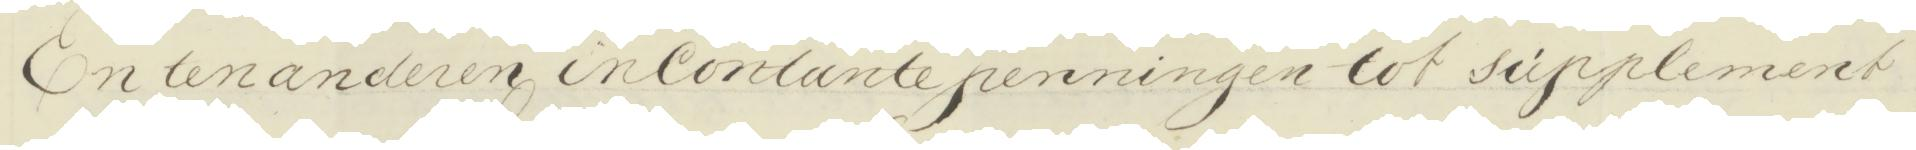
En ten anderen in contante penningen tot supplement
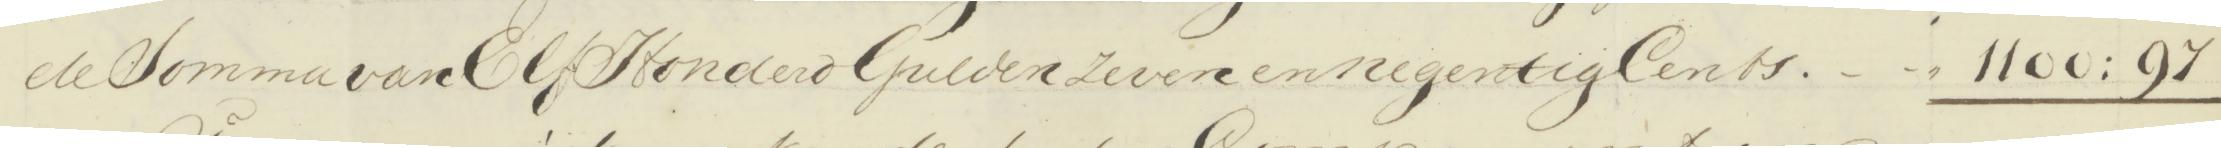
de Somma van Elf Honderd Gulden zeven en negentig Cents. . . „ 1100: 97
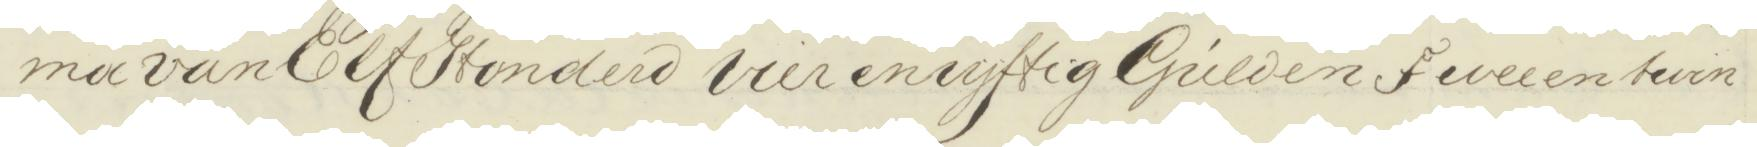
ma van Elf Honderd vier en vijftig Gulden Twee en twin
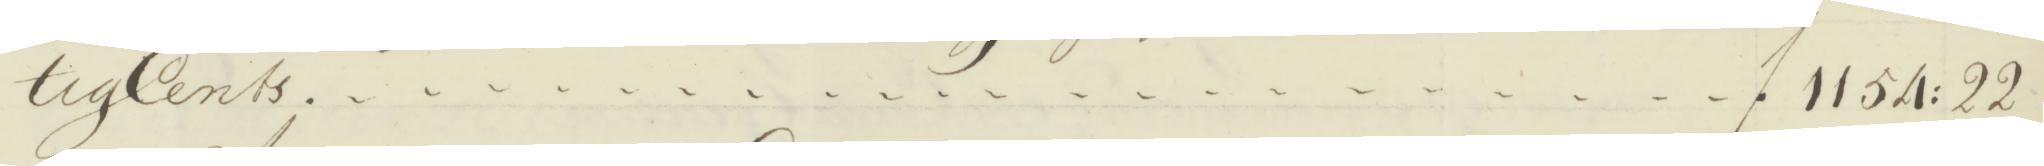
tig Cents . . . . . . . . . . . . . . . . . . . . . . . . . ƒ 1154:22.
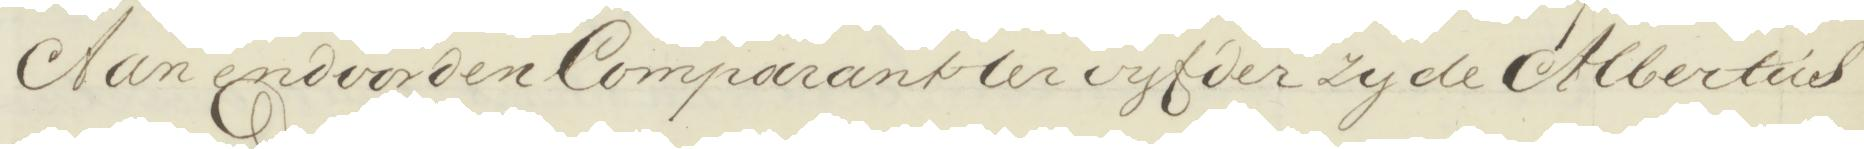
Aan en door den Comparant ter vyfder zyde Albertus
